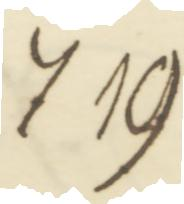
719
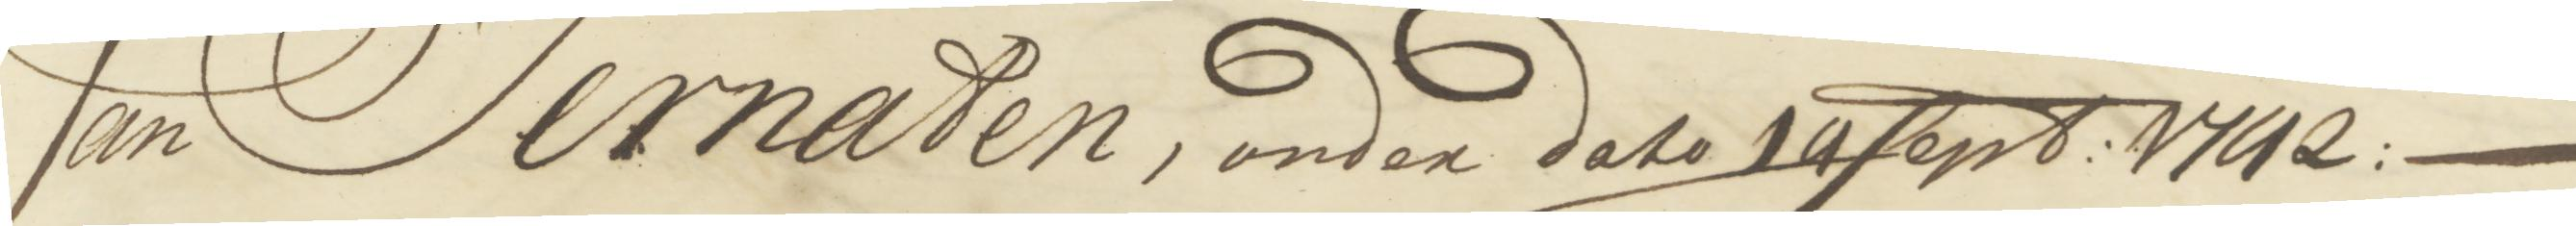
Van Ternaten, onder dato 14 Sept: 1742: —
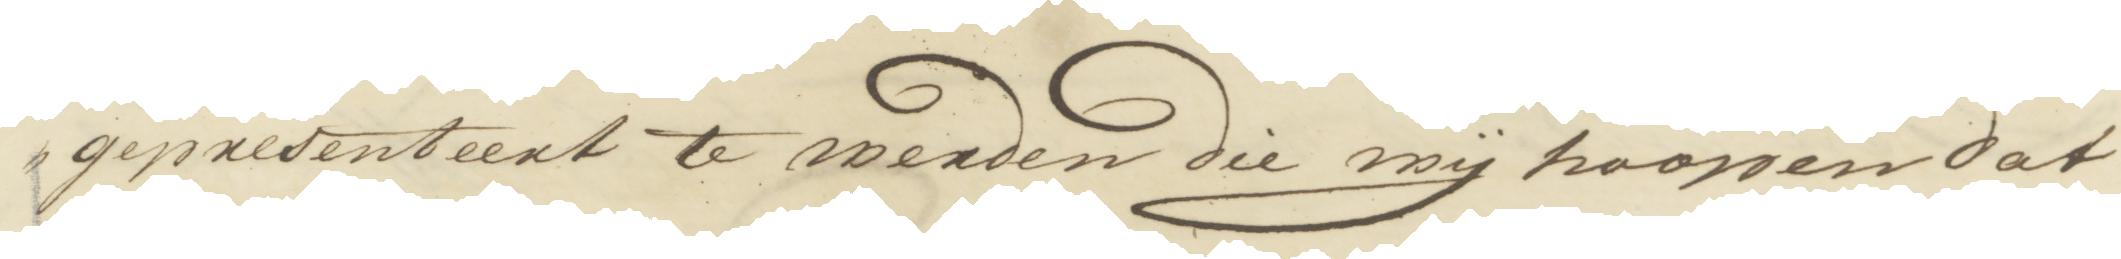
„gepresenteert te werden die wij hoopen dat
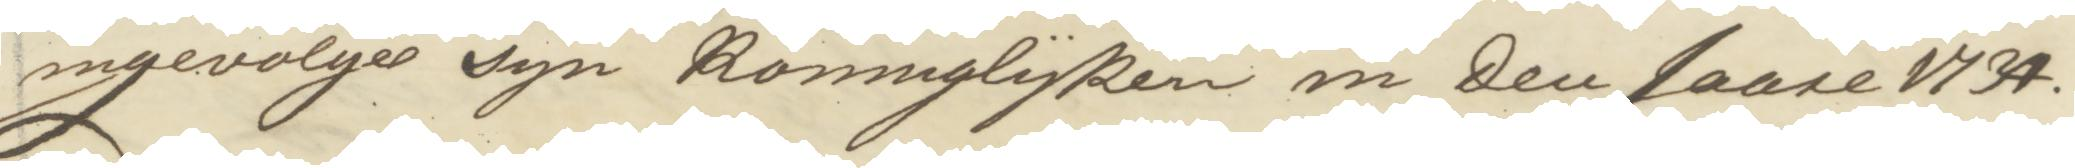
ingevolge sijn koninglijken in den Jaare 1734.
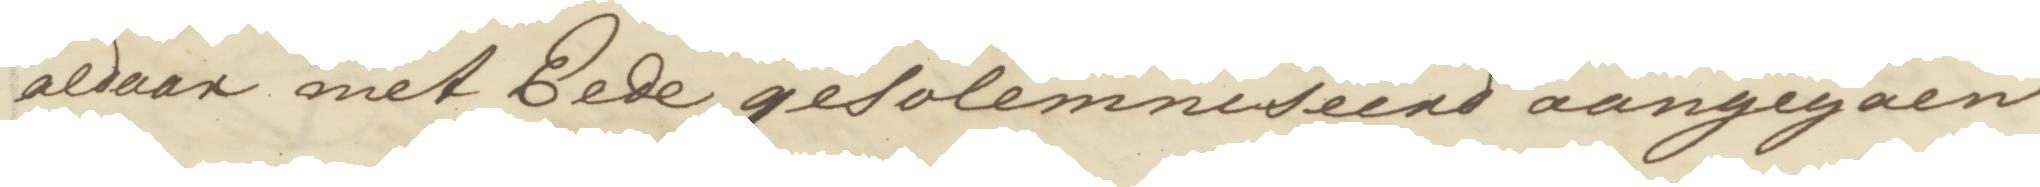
aldaar met Eede gesolemniseerd aangegaen
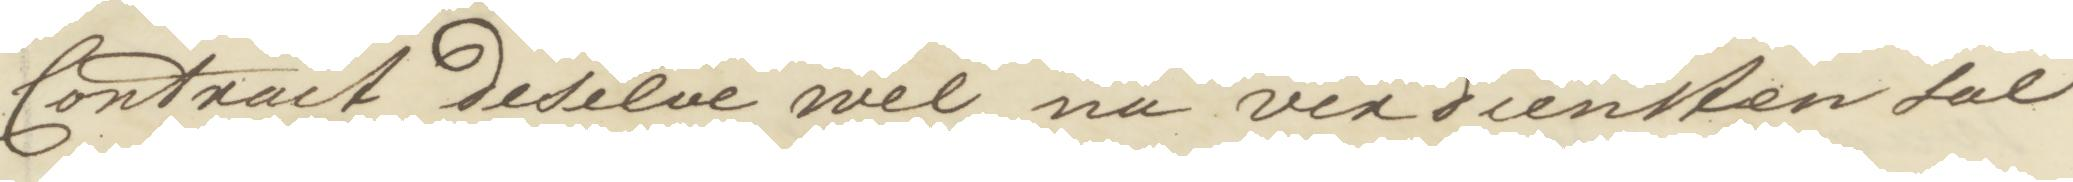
Contract deselve wel na verdiensten sal
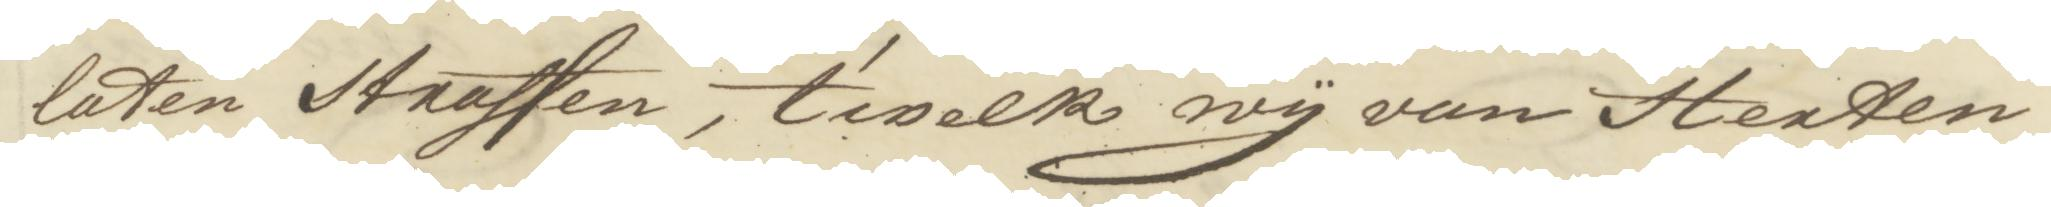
laten straffen, t'welk wij van Herten
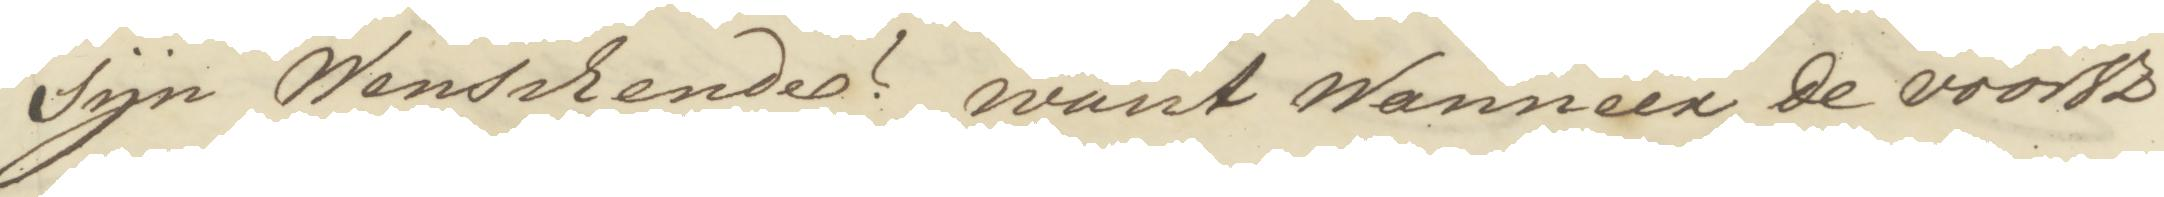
sijn wenschende! want wanneer de voorsz
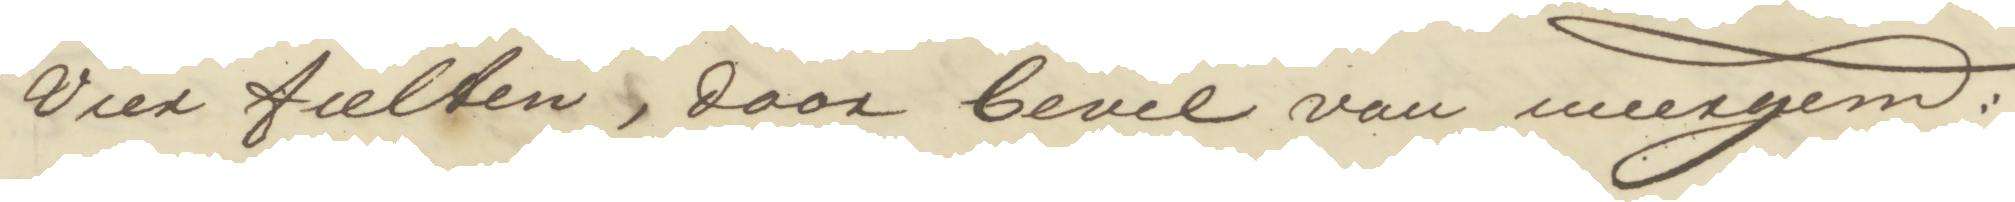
vier fielten, door bevel van meergem:
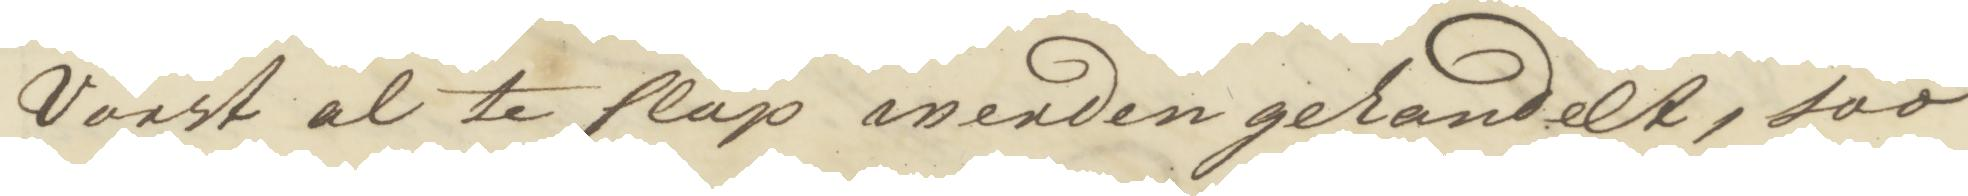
vorst al te slap werden gehandelt, soo
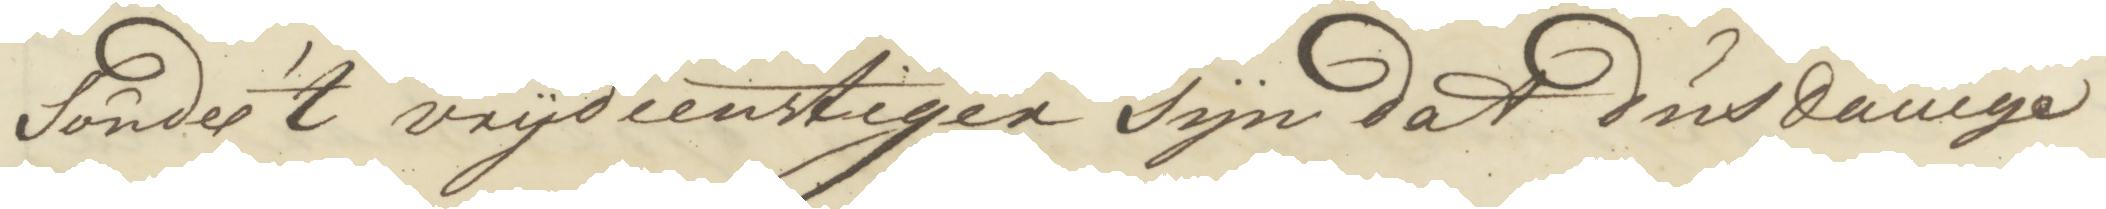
soude ’t vrijdienstiger sijn dat dusdanige
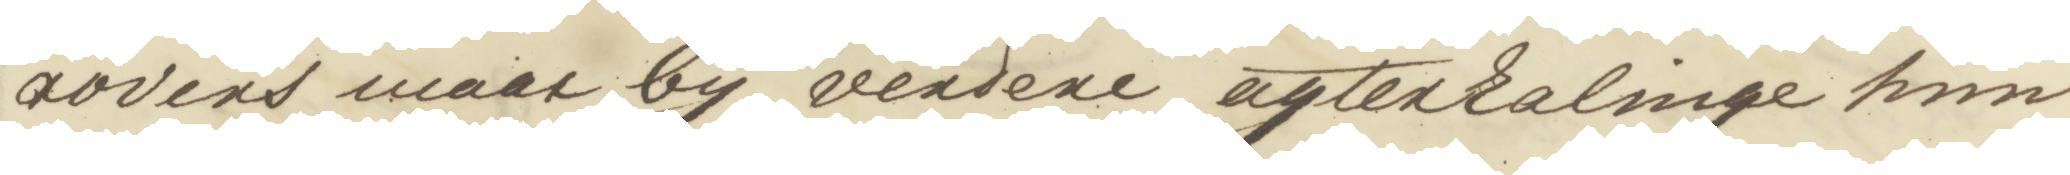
rovers maar bij verdere agterhalinge hun
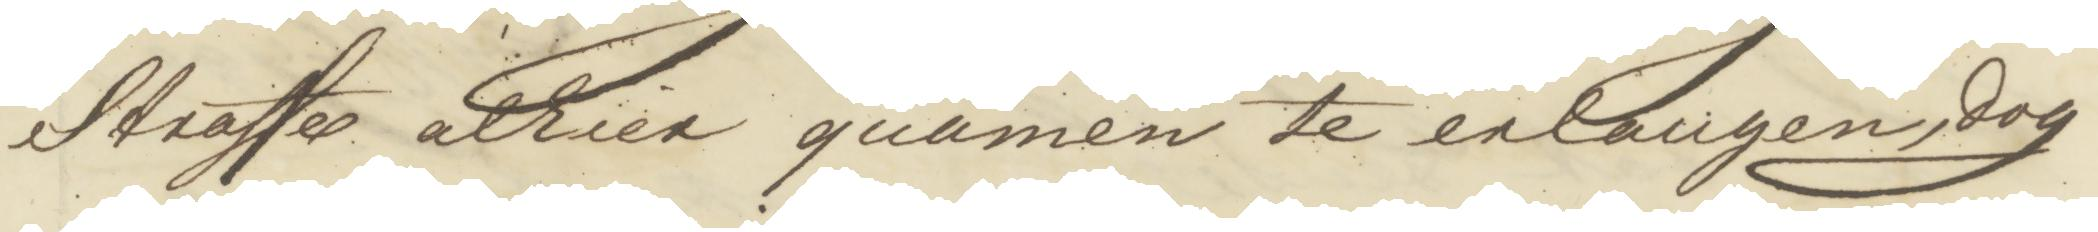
Straffe alhier quamen te erlangen, dog
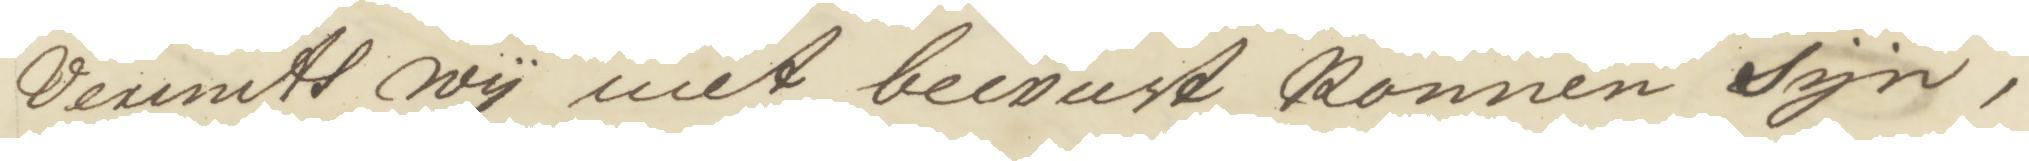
vermits wij niet bewust konnen sijn,
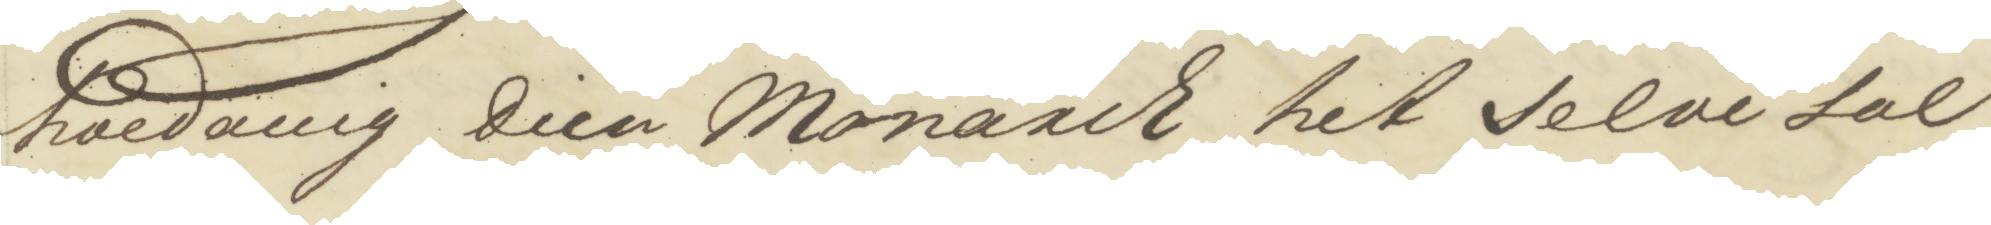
hoedanig dien monarch het selve sal
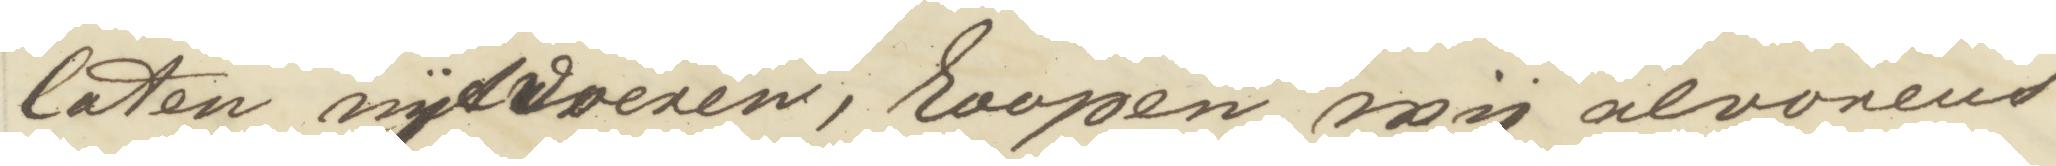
laten uijtvoeren; hoopen wij alvorens
